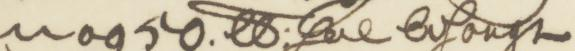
nog 50. lb: sal besorgt
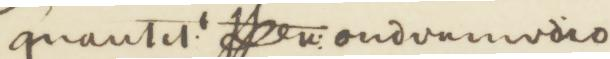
quantit.t pper: ondermedio
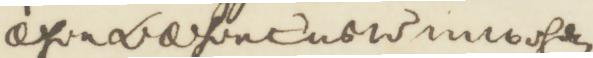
deser te deser custe in wesen
